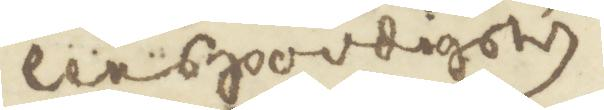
lerspoedigsten
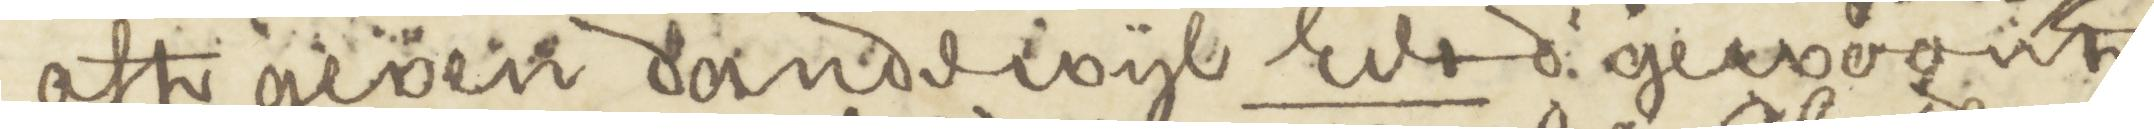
afte geven dan dewijl het d' gewoonte
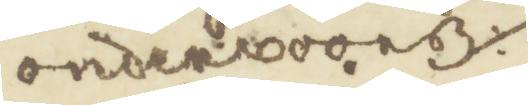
onder voorsz:
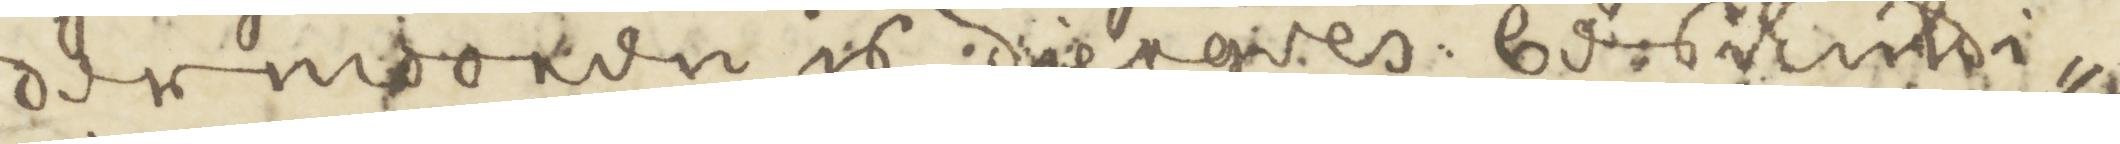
der mooren is diergelijk beschuldi„
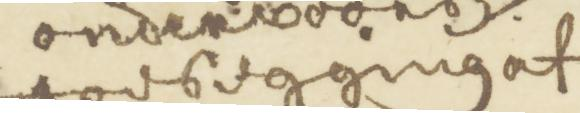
toesegging af
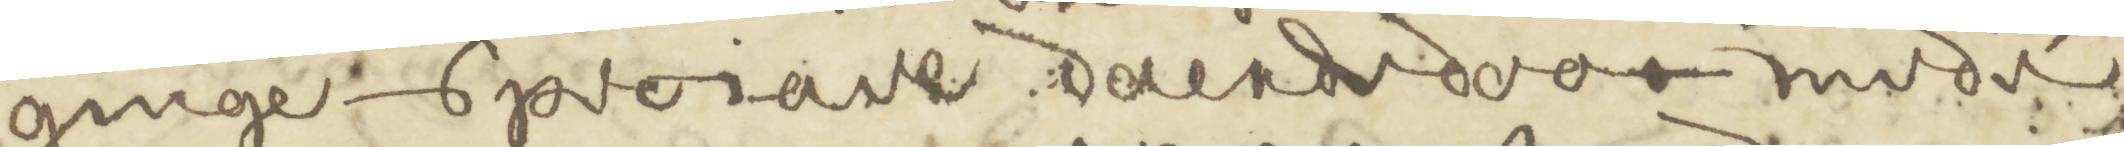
ginge speciael daer de doot mede
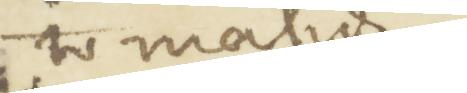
te maken.
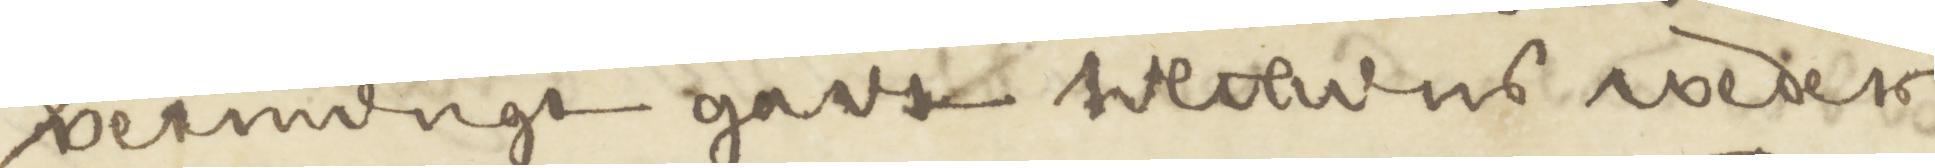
vermengt gaet telckens weder
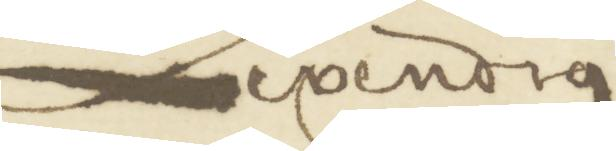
Levendig
